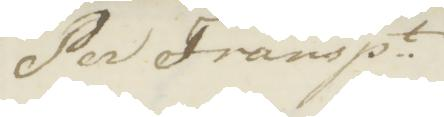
Per Transp..t
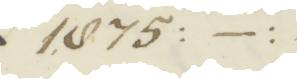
ƒ 1.875: —:
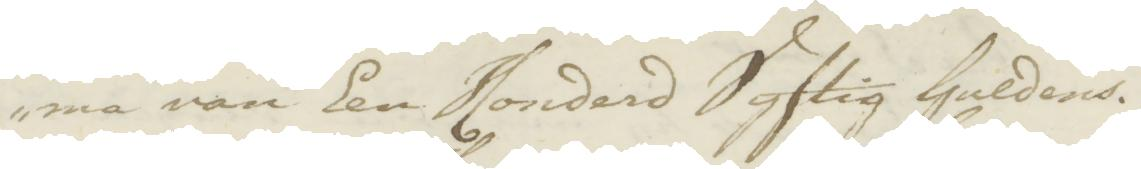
„ma van Een Honderd Vyftig Guldens.
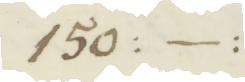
150: —:
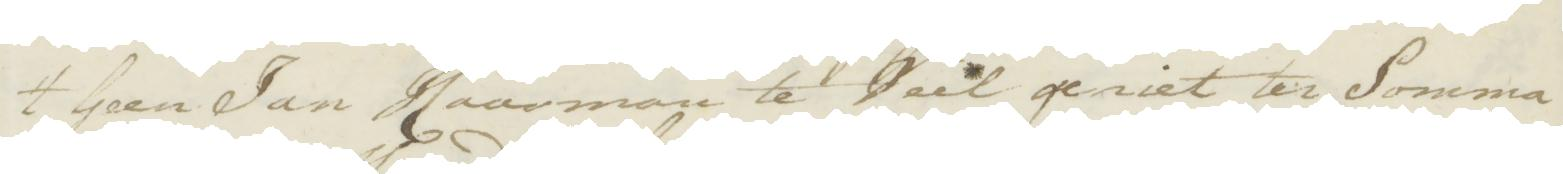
’t Geen Jan Haarman te Veel geniet ter Somma
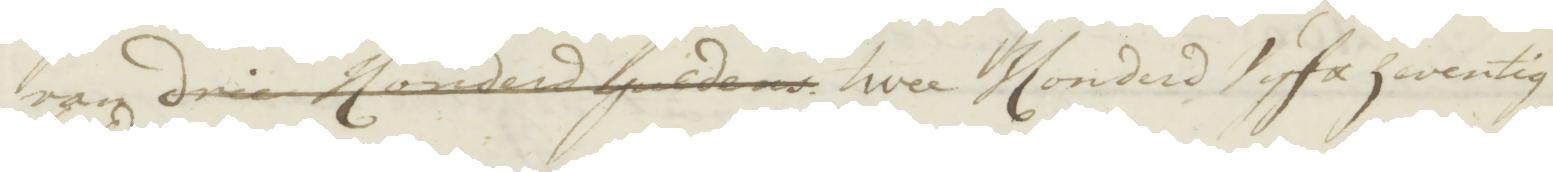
van drie Honderd Guldens twee Honderd Vyf & zeventig
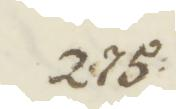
275:
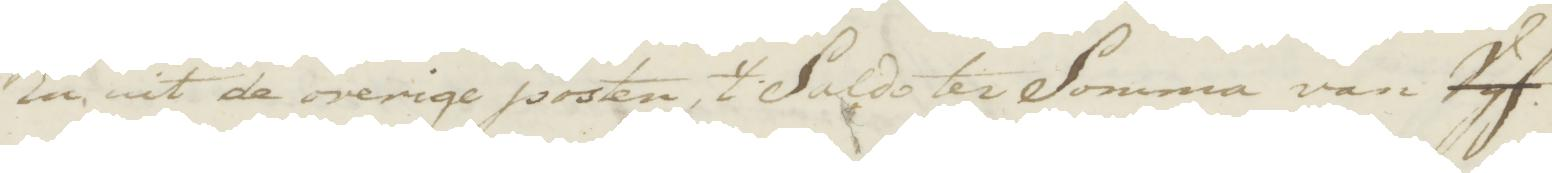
En uit de overige posten, 't Saldo ter Somma van Vyf.
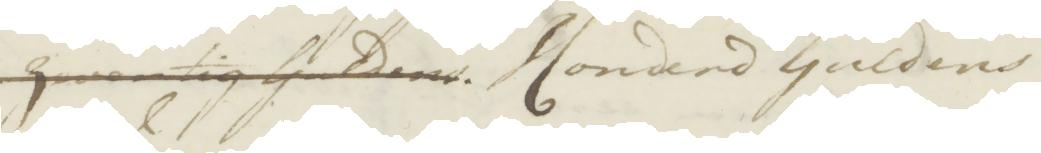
en zeventig Guldens. Honderd Guldens
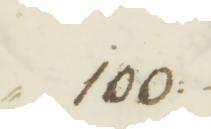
„ 100:
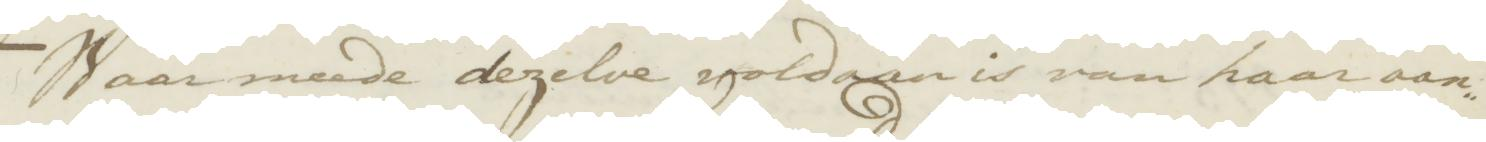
Waar meede dezelve voldaan is van haar aan„
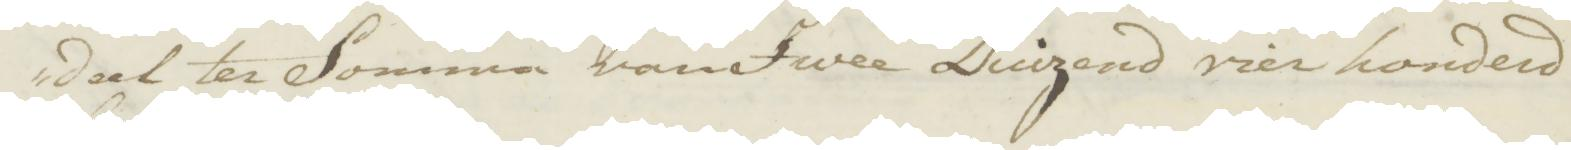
„deel ter Somma van Twee Duizend vier honderd
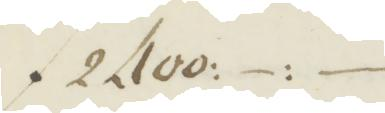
ƒ 2400: —: —
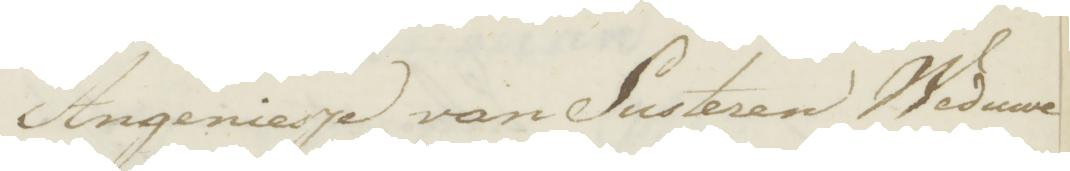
Angeniesje van Susteren Weduwe
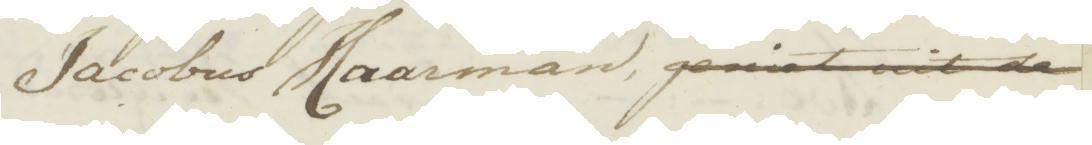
Jacobus Haarman, geniet uit de
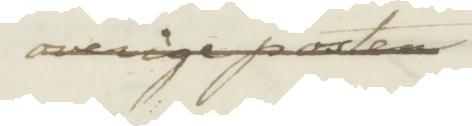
overige posten
